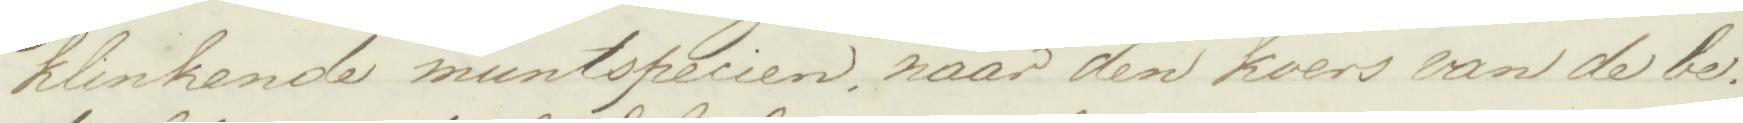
klinkende muntspecien, naar den koers van de be„
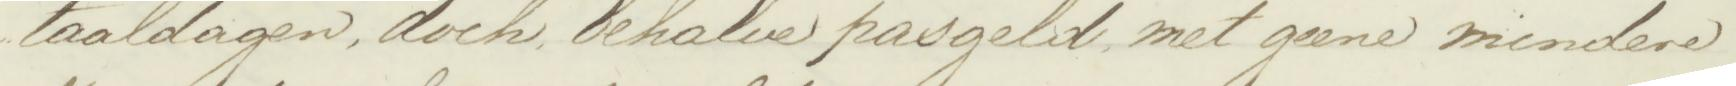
„taaldagen, doch, behalve pasgeld, met geene mindere
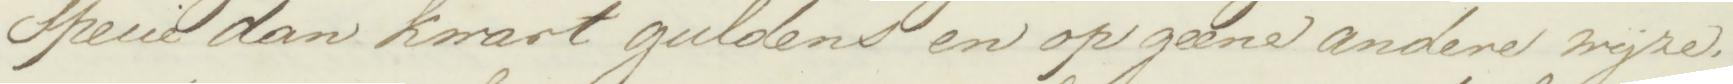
specie dan kwart guldens en op geene andere wijze.
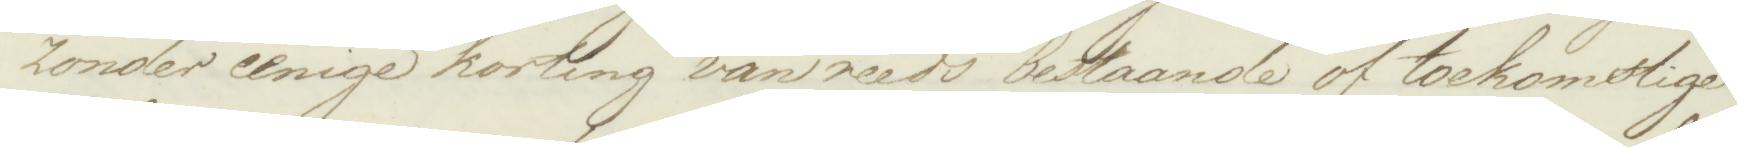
zonder eenige korting van reeds bestaande of toekomstige
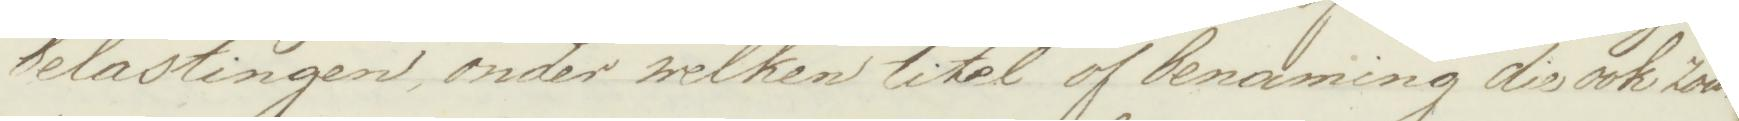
belastingen, onder welken titel of benaming die ook zou
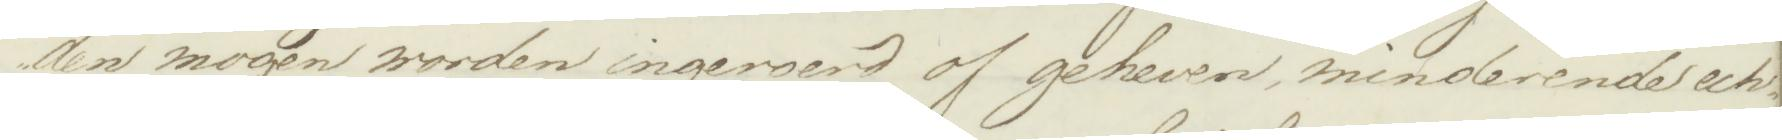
„den mogen worden ingevoerd of geheven, minderende ech„
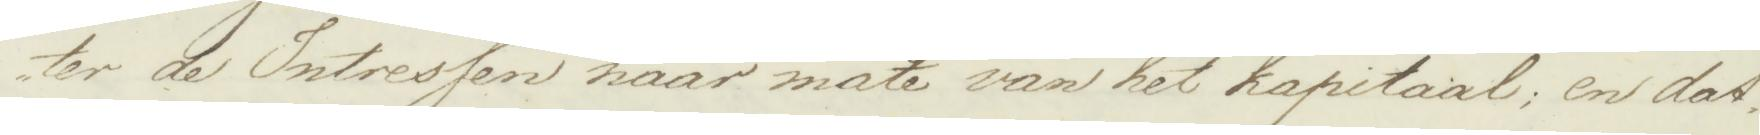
„ter de Intressen naar mate van het kapitaal; en dat,
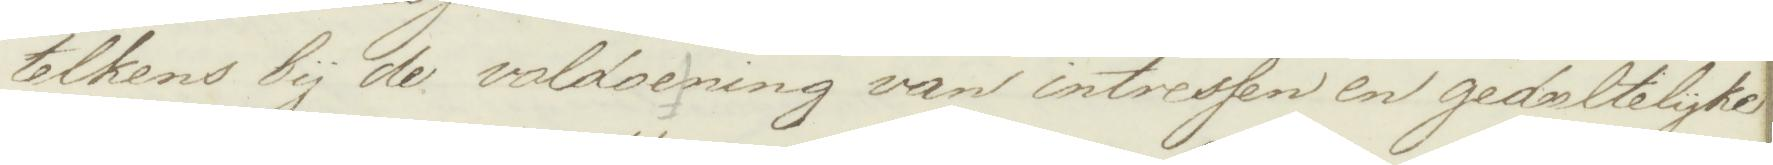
telkens bij de voldoening van intressen en gedeeltelijke
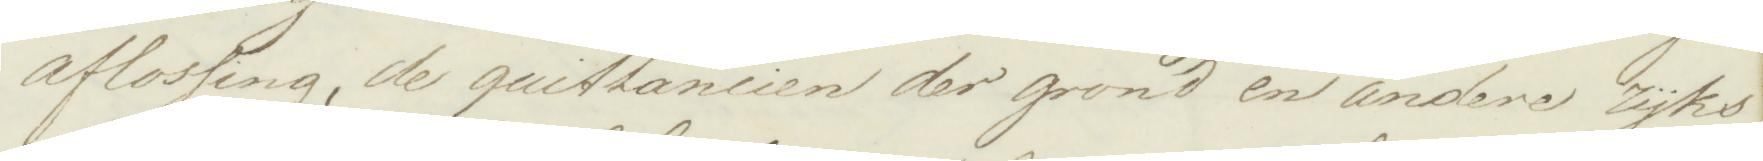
aflossing, de quittancien der grond en andere rijks
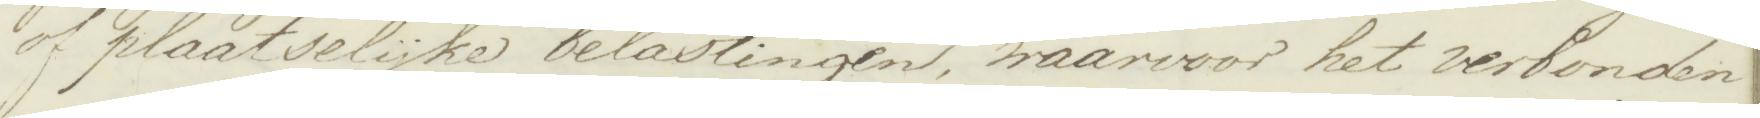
of plaatselijke belastingen, waarvoor het verbonden
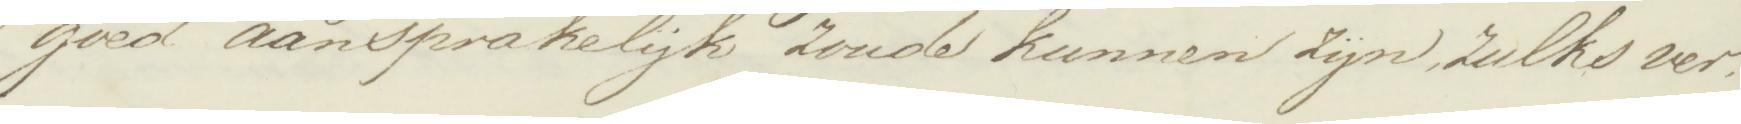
goed aansprakelijk zoude kunnen zijn, zulks ver„
